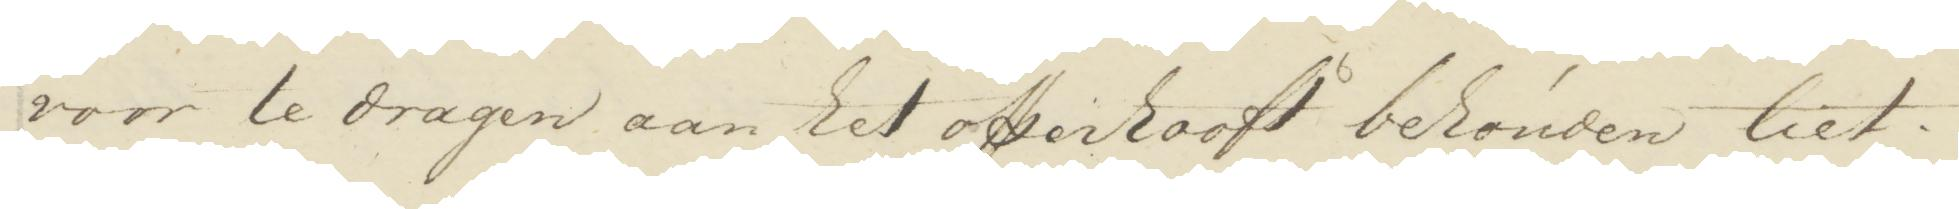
voor te dragen aan het opperhooft behouden liet.
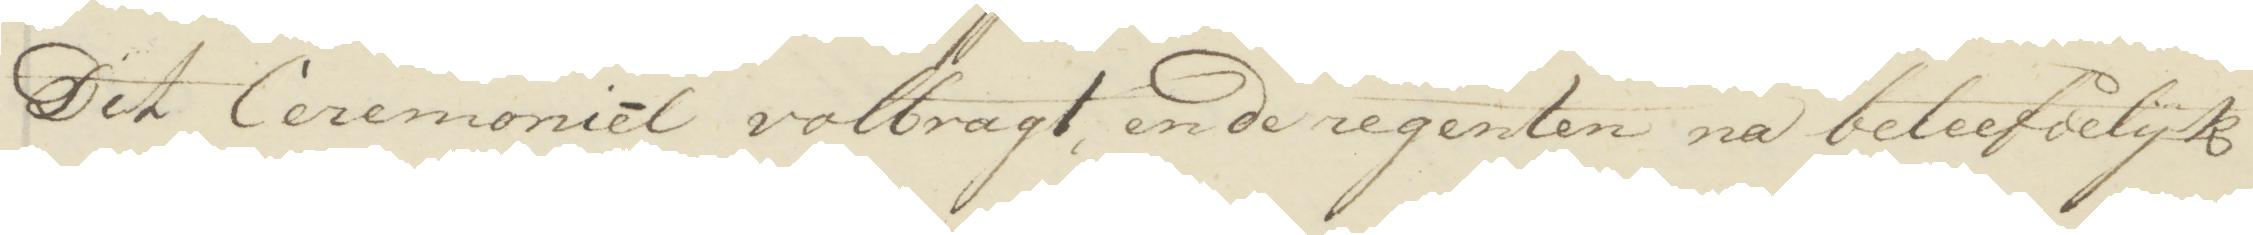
Dit Ceremoniel volbragt, ende regenten na beleefdelijk
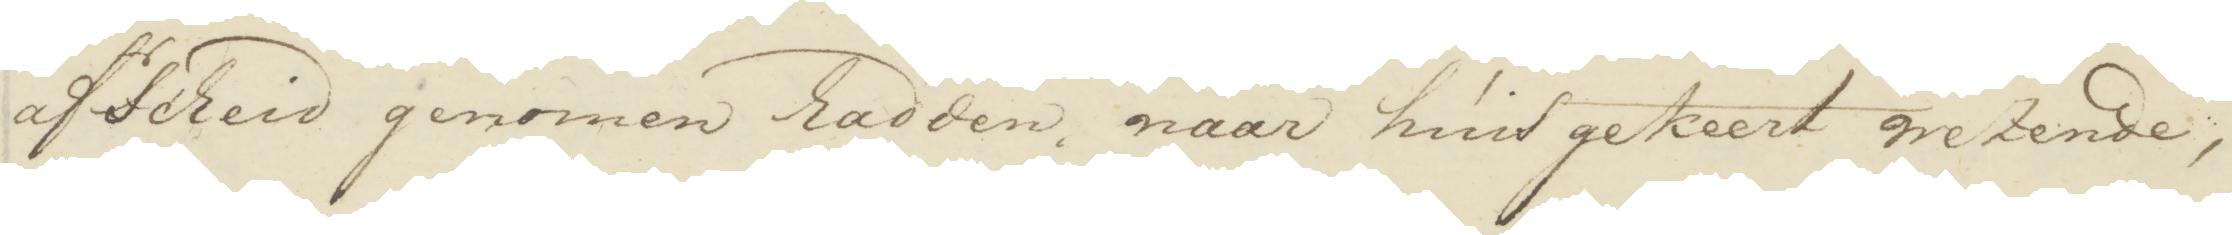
afscheid genomen hadden, naar huis gekeert wezende,
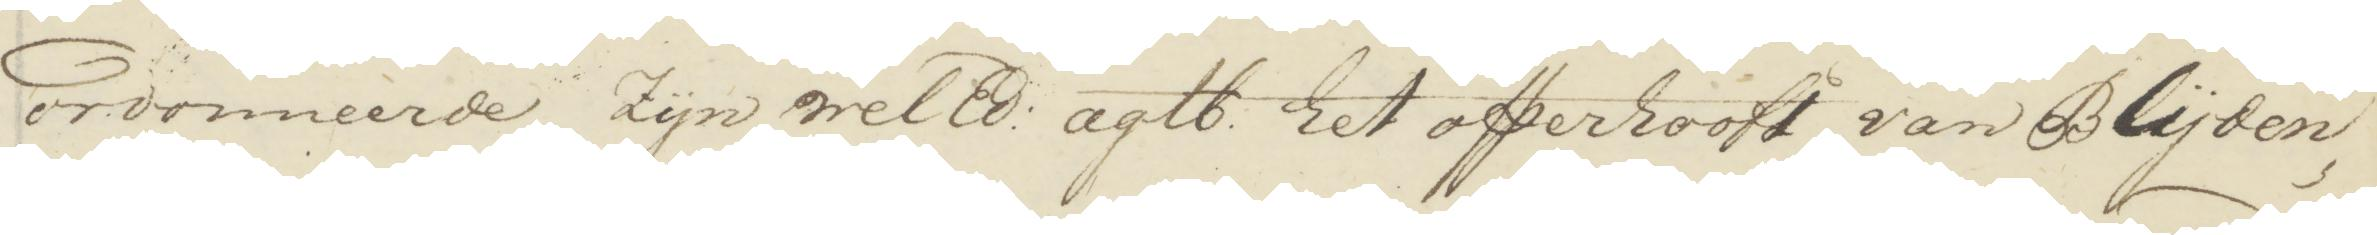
ordonneerde Zijn wel Ed: agtb: het opperhooft van Blijden„
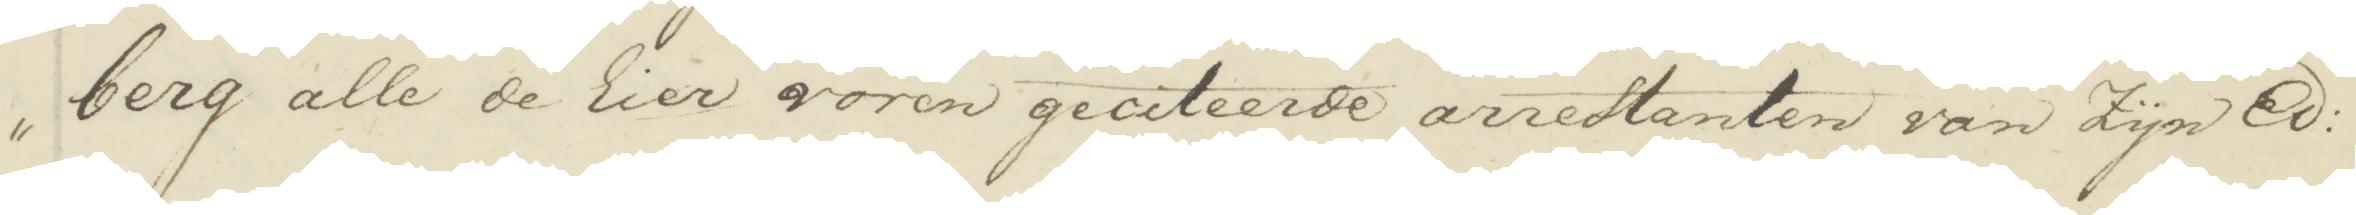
„berg alle de hier voren geciteerde arrestanten van Zijn Ed:
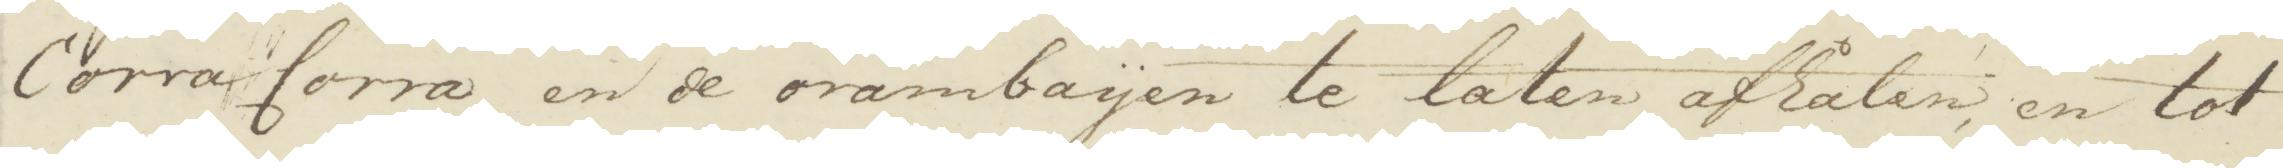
Corra Corra en de orambaijen te laten afhalen; en tot
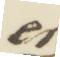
er
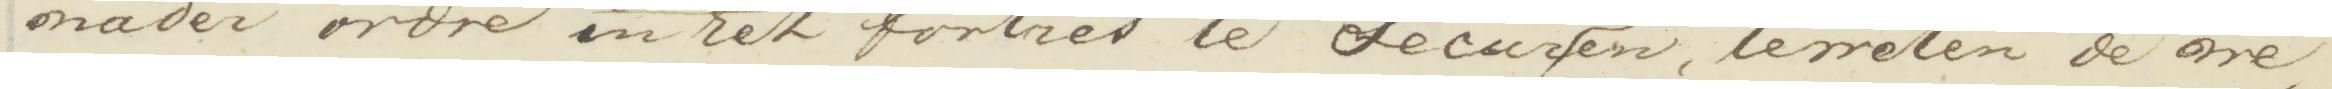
nader ordre in het fortres te secur^en, te weten de we
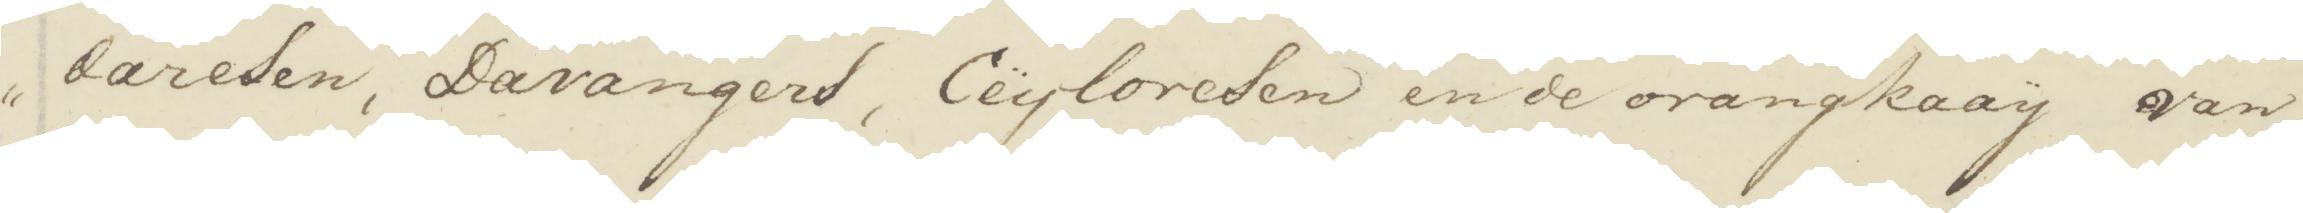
daresen, Davangers, Ceijloresen en de orangkaaij van
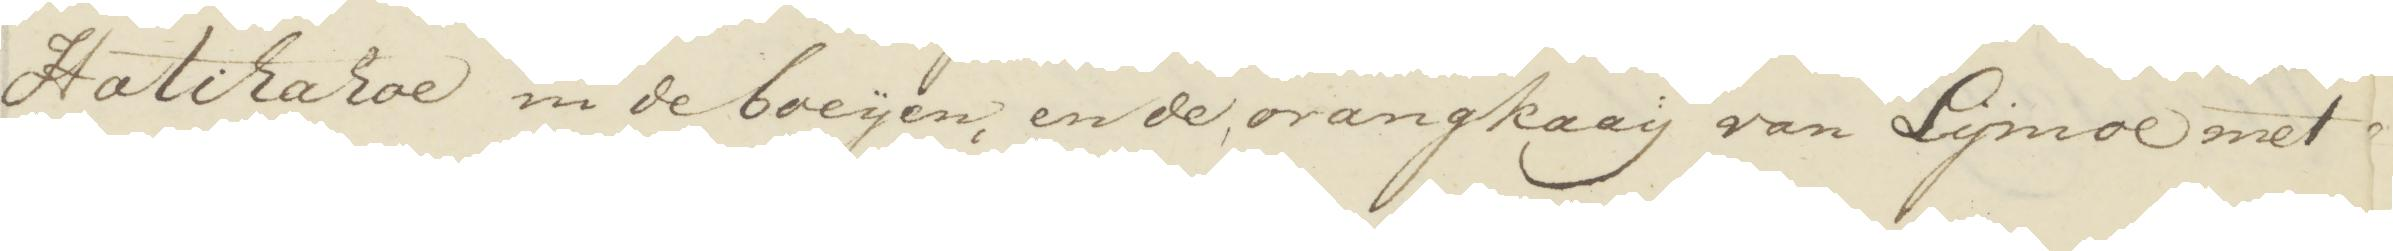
Hatihahoe in de boeijen, en de orangkaaij van Lijmoe met
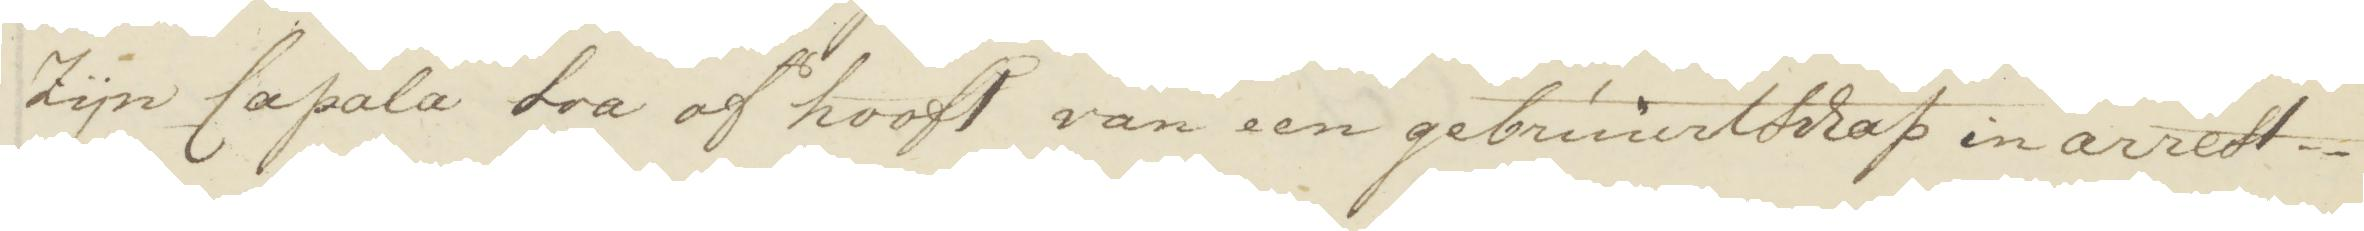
zijn Capala Soa of hooft van een gebruurtschap in arrest--
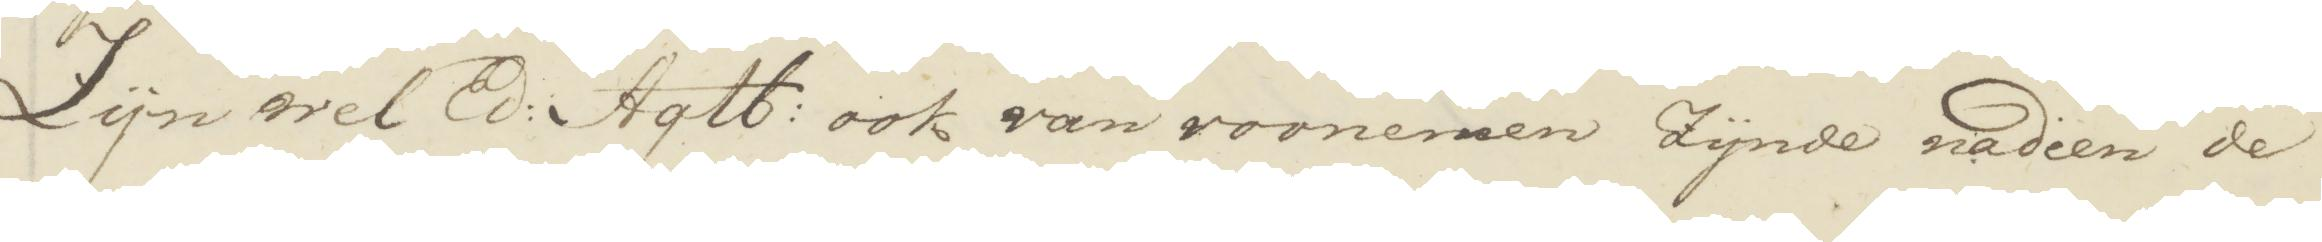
Zijn wel Ed: Agtb: ook van voonemen Zijnde nadien de
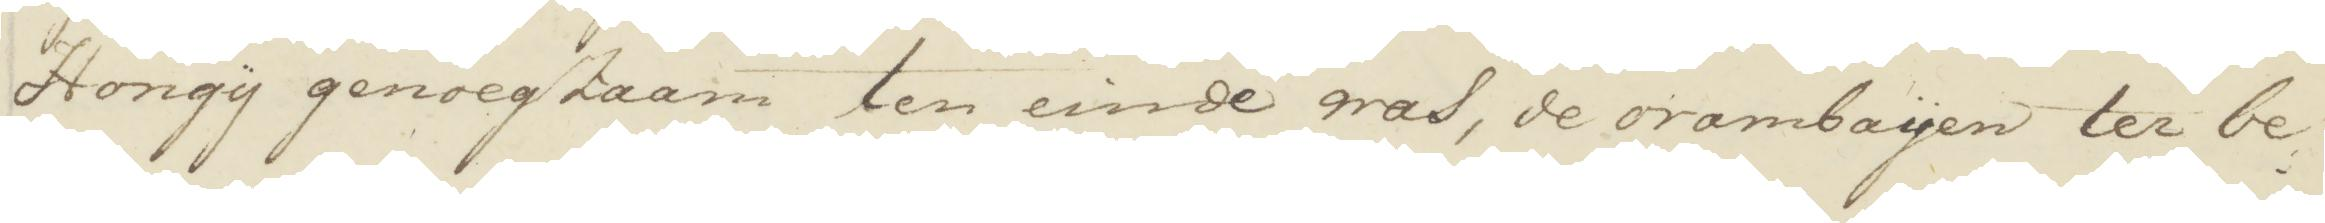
Hongij genoegzaam ten einde was, de orambaijen ter be„
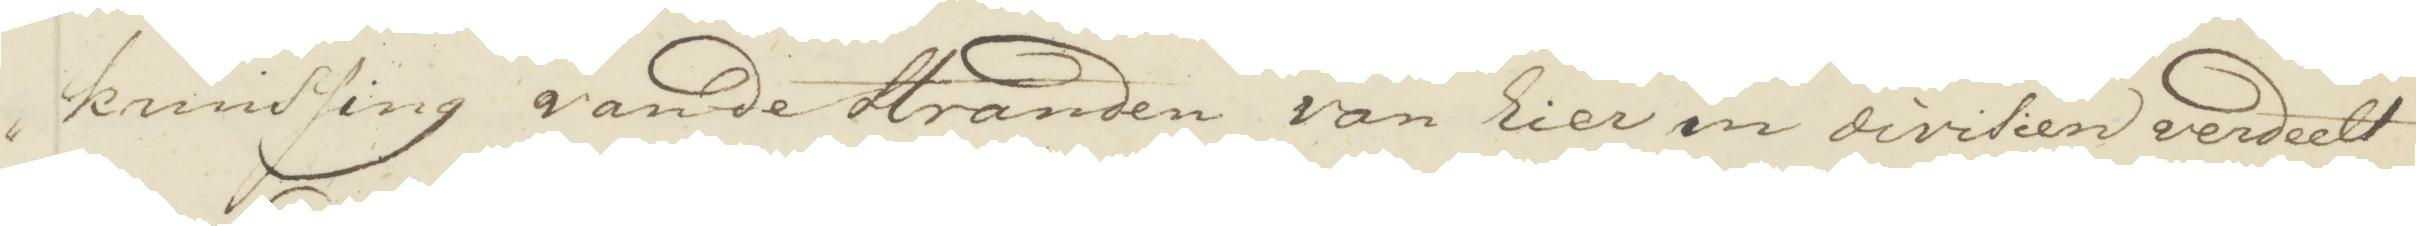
kruissing van de Stranden van hier in divisien verdeelt
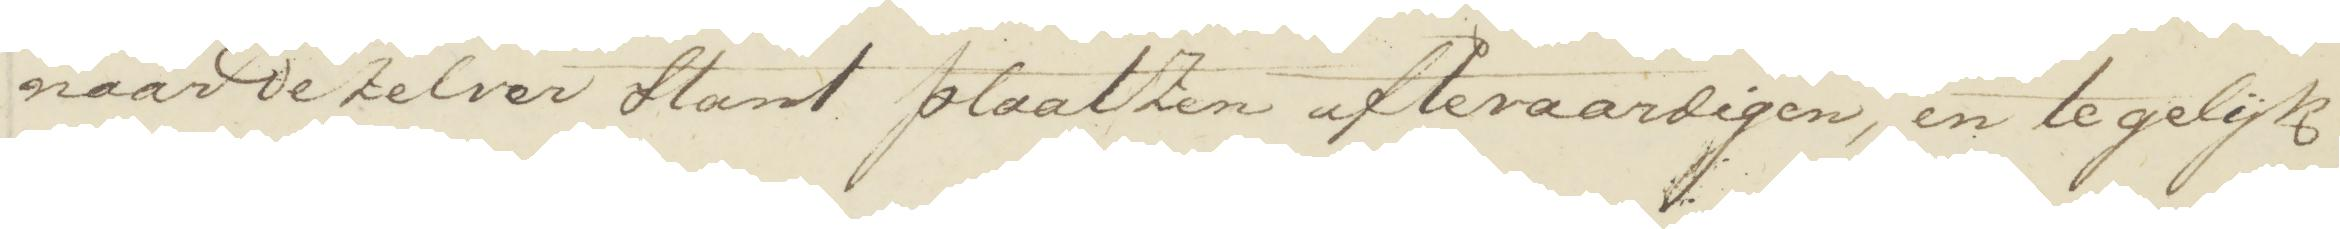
naar de Zelver Stant plaatzen af te vaardigen, en te gelijk
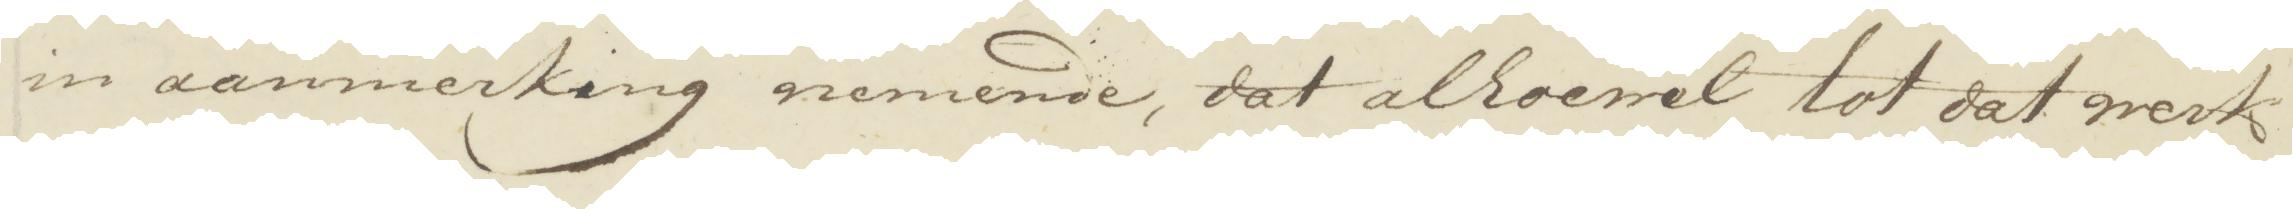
in aanmerking nemende, dat alhoewel tot dat werk
